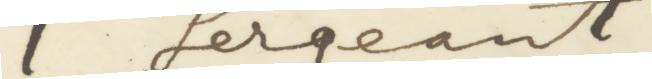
1 sergeant
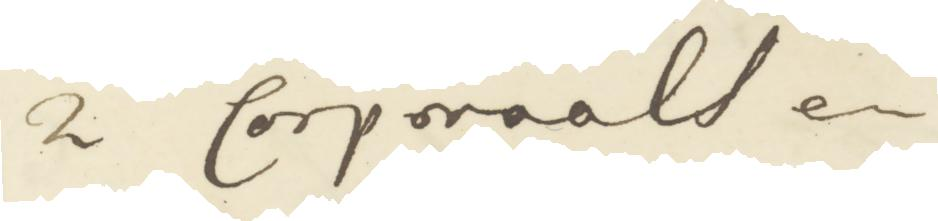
2 Corporaals en
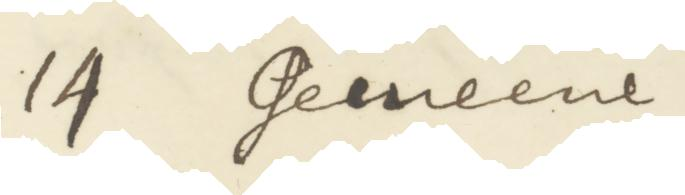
14 Gemeene
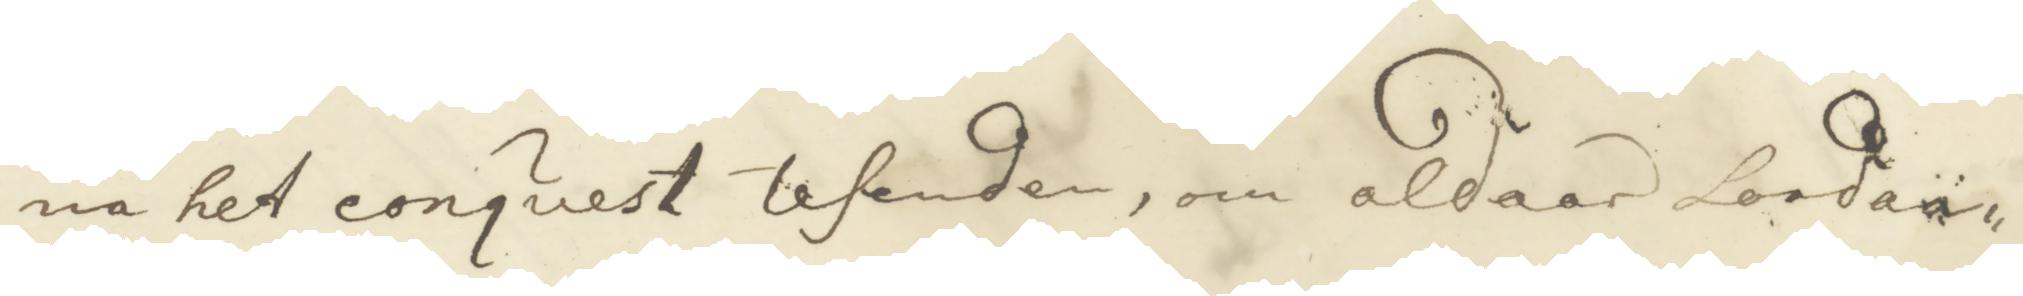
na het conquest tesenden, om aldaar soo daa„
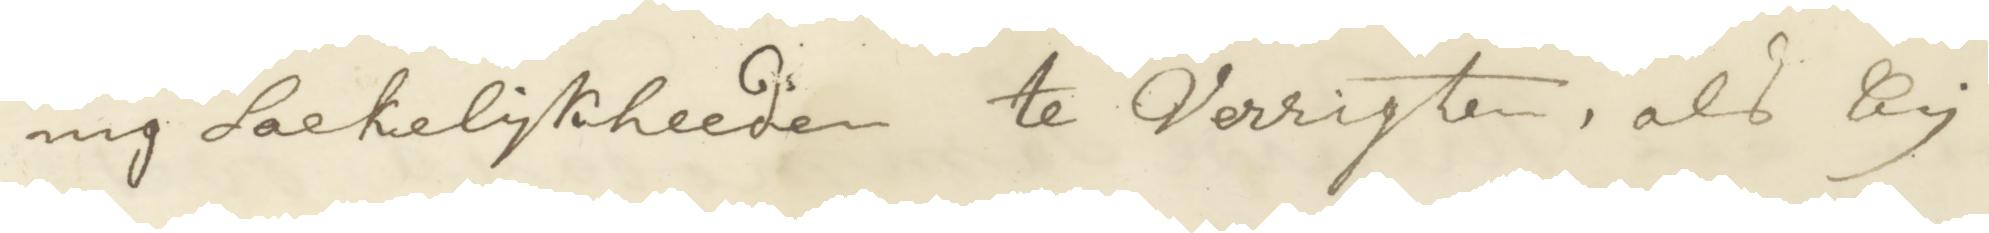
nig saekelijkheeden te verrigten, als bij
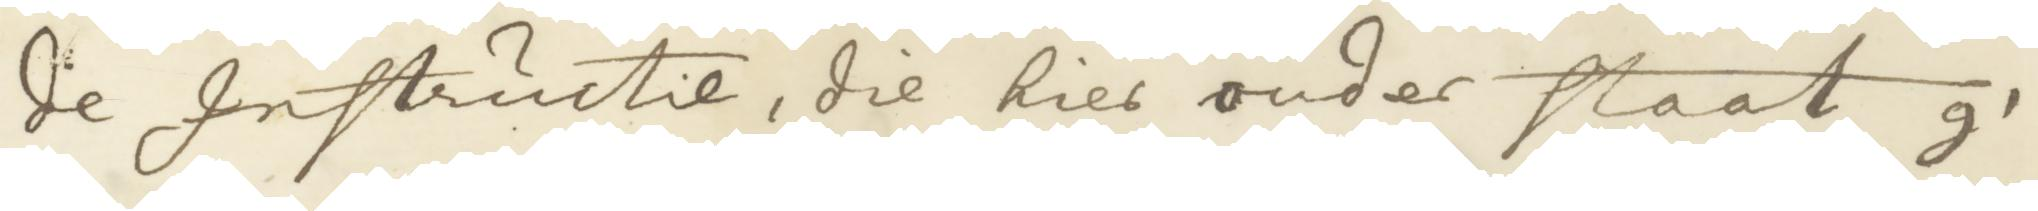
de Jnstructie, die hier onder staat g’
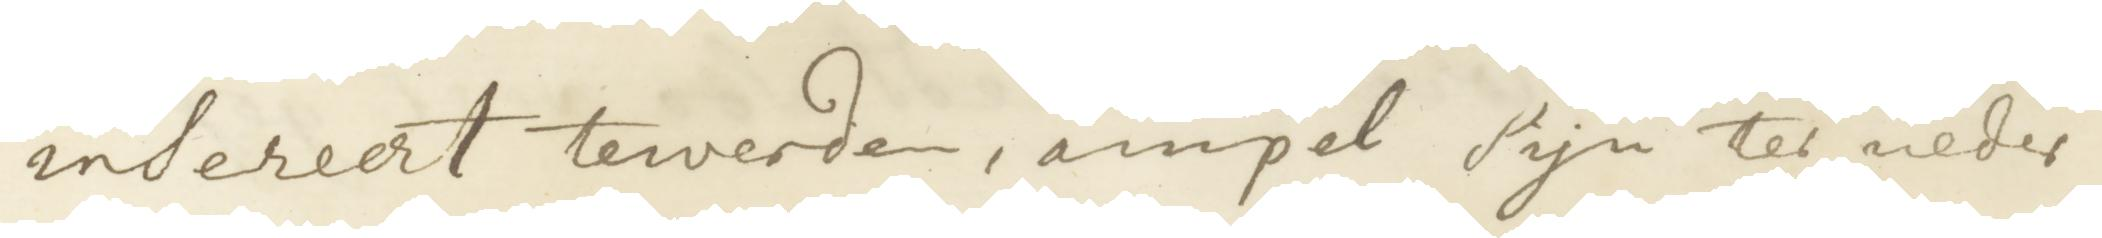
insereert tewerden, ampel sijn ter neder
